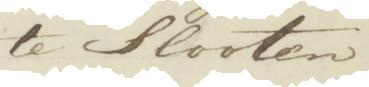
te Slooten
